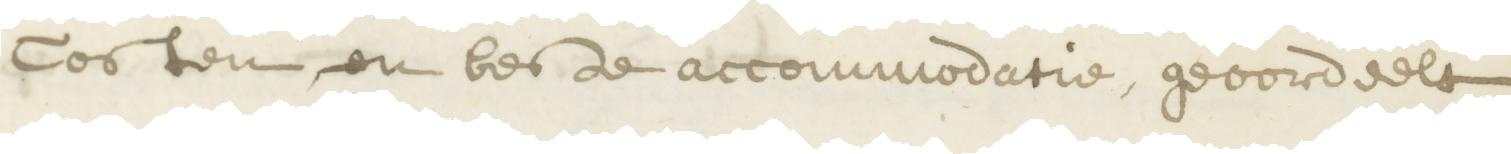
Costen en beste accommodatie, geoordeelt
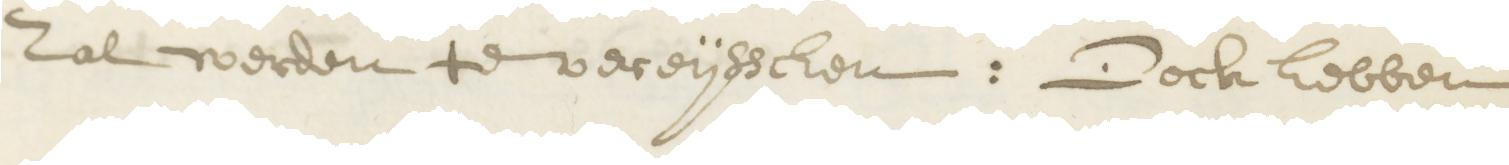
zal werden te vereijsschen: Oock hebben
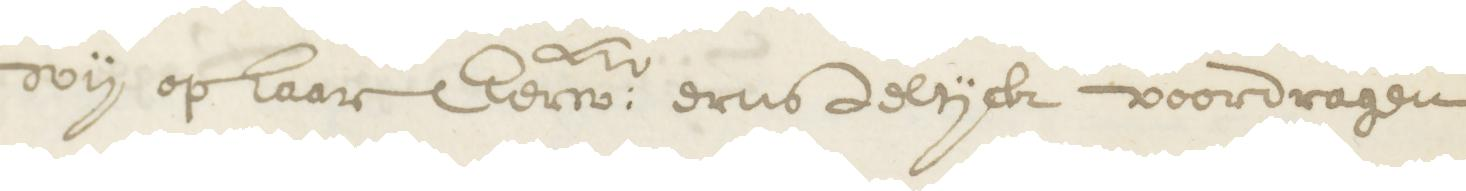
wij op haar Eerw: ernstelijck voordragen
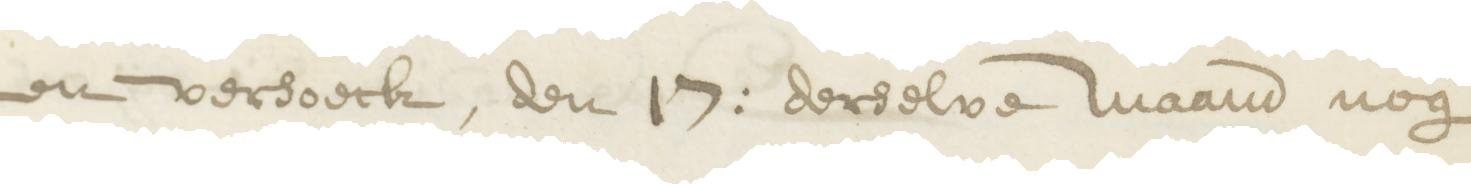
en versoeck, den 17: derselve maand nog
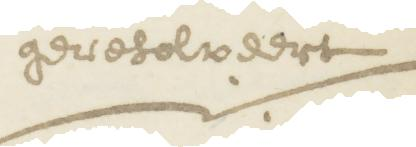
geresolveert
